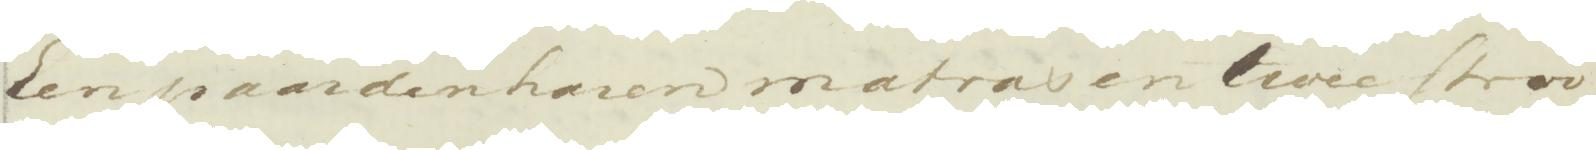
Een paardenharen matras en twee stroo
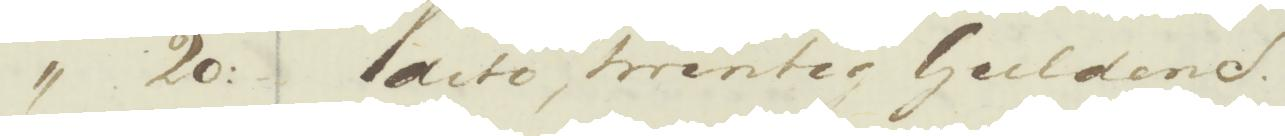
„ 20:- dito, twintig Guldens.
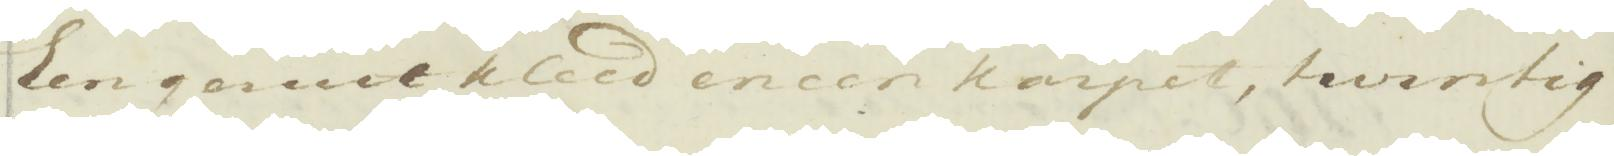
Een geruit kleed een karpet, twintig
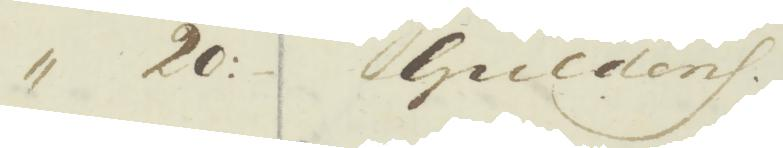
„ 20:- Guldens.
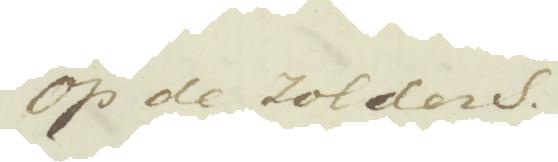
Op de zolders.
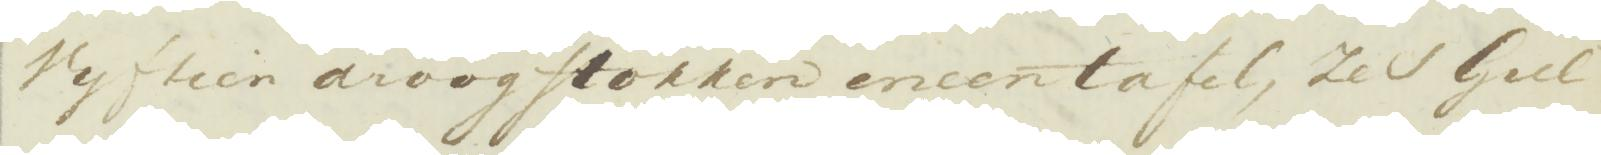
Vijftien droog stokken en een tafel, zes Gul
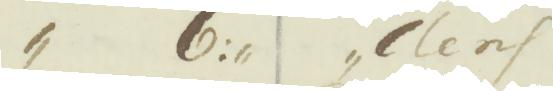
„ 6:„ „dens
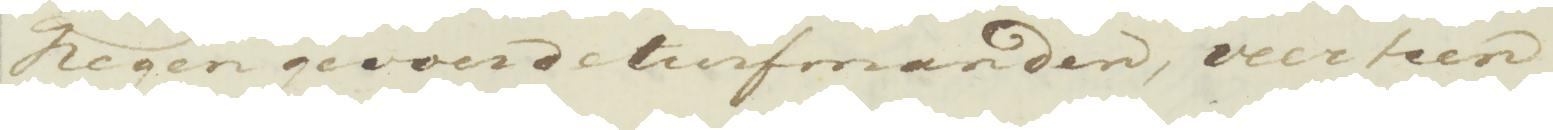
Negen gevoerde turfmanden, veertien
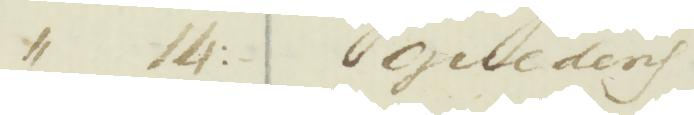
„ 14:- Guldens
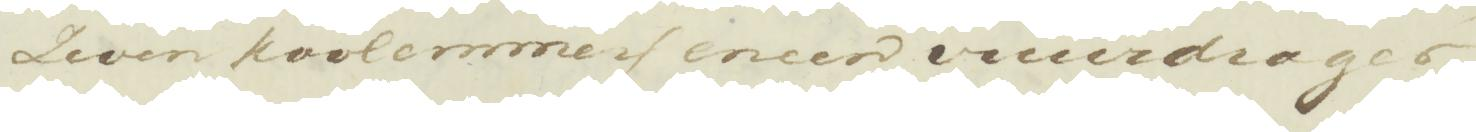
Zeven koolemmers eneen vuurdrager
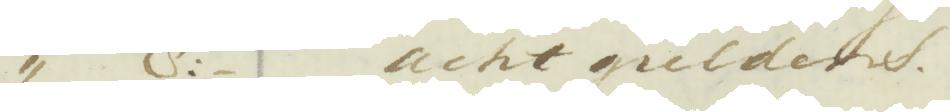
„ 8:- acht guldens.
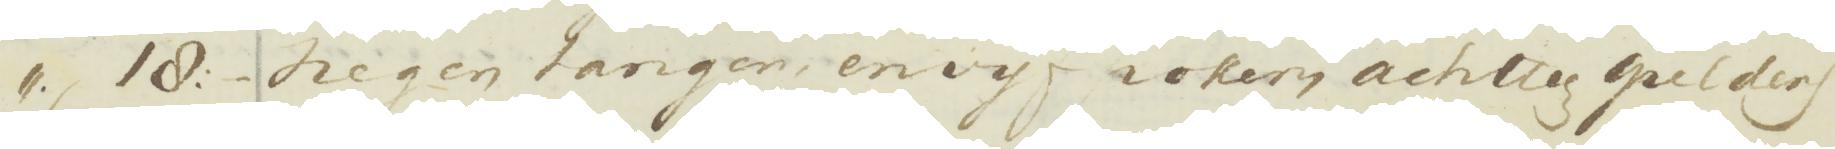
„ 18:- Negen tangen, en vyf poken achttien guldens
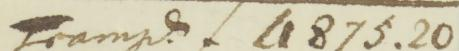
Transpt ƒ 4875.20
